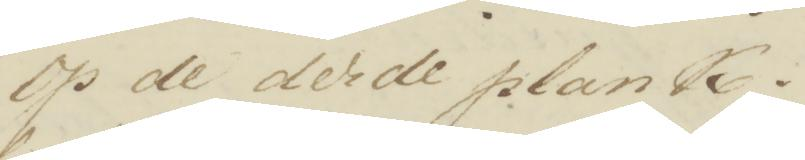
Op de derde plank.
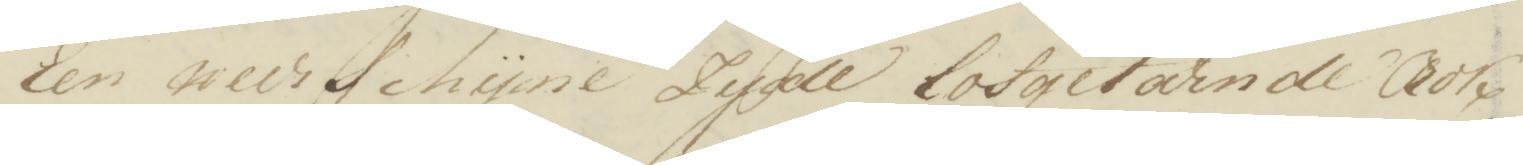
Een weerschijne zyde losgetarnde Rok,
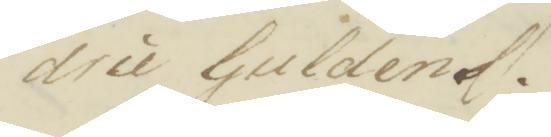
drie Guldens . . . . . . . . „ 3 „
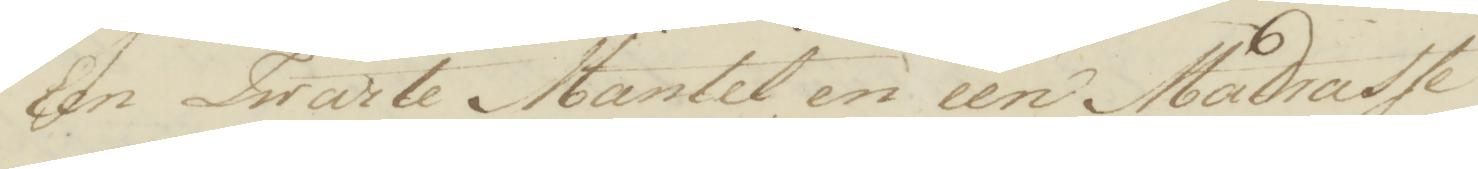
Een Zwarte Mantel en een Madrasse
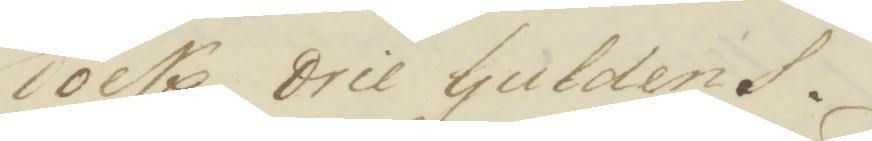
doek drie Guldens . . . . . . . „ . 3 „
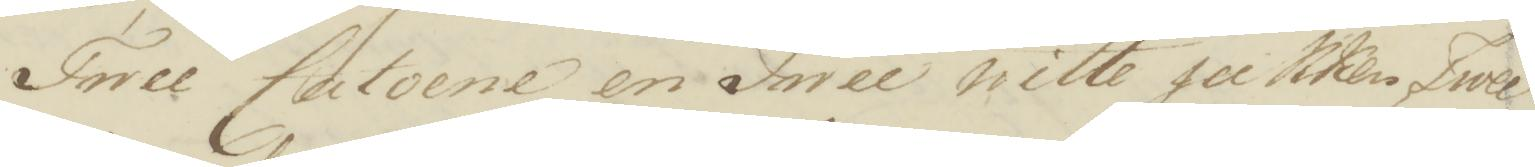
Twee Catoene en twee witte jakken Twee
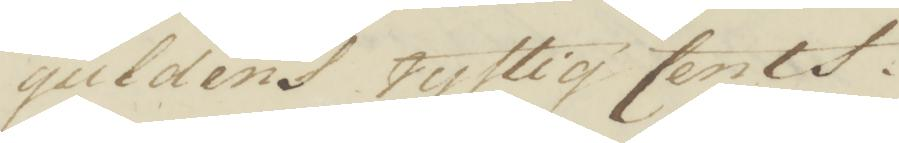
guldens vyftig Cents . . . . . . . „ 2 50
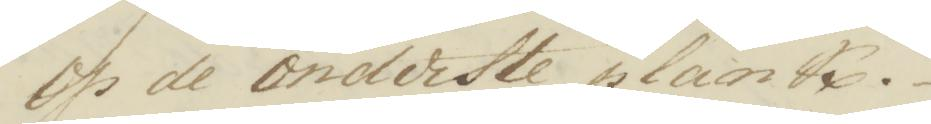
op de onderste plank.
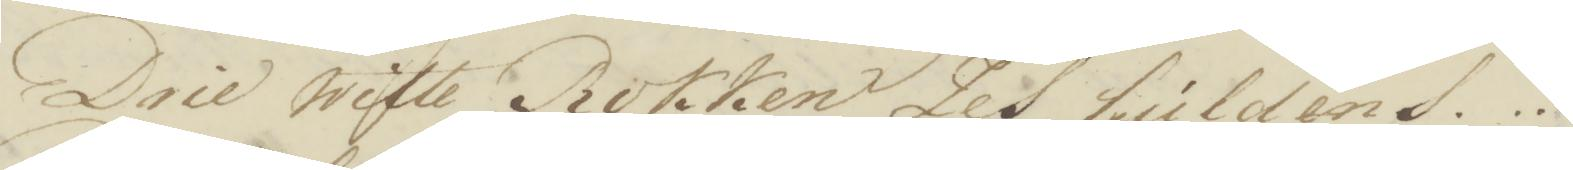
Drie witte Rokken, Zes Guldens . . . 6 „
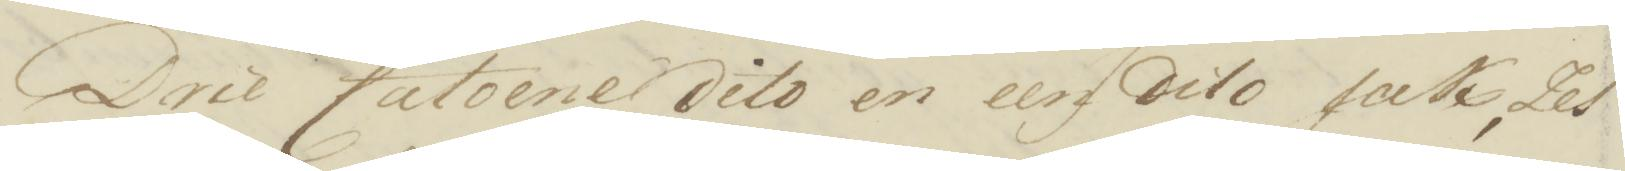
Drie Catoene dito en een dito jak, zes
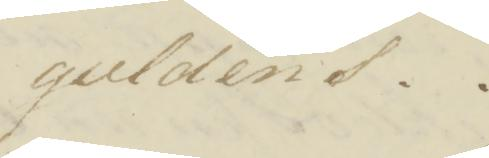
guldens . . . . . . . . „ 6 „
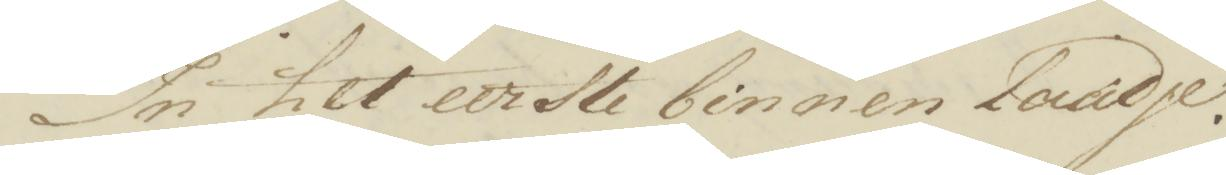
Jn het eerste binnen laadje
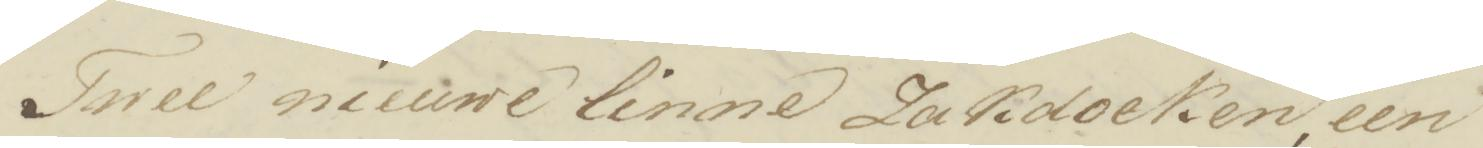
Twee nieuwe linne zakdoeken, een
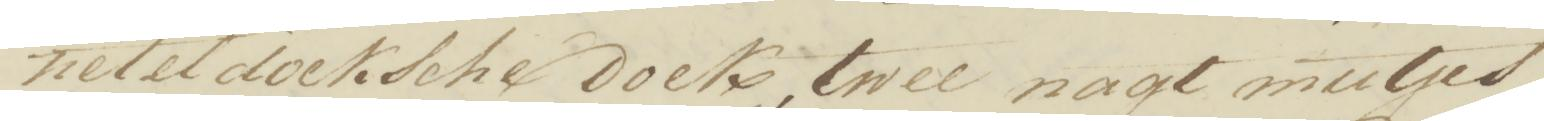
neteldoeksche doek, twee nagt mutjes,
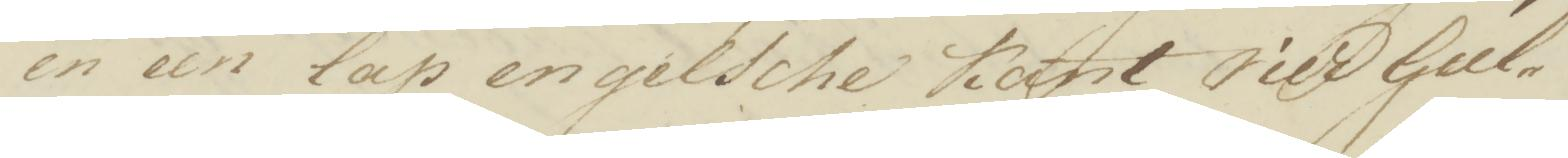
en een lap en gelsche kant, vier Gul„
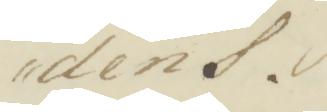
„dens . . . . . . . . . . . „ 4
